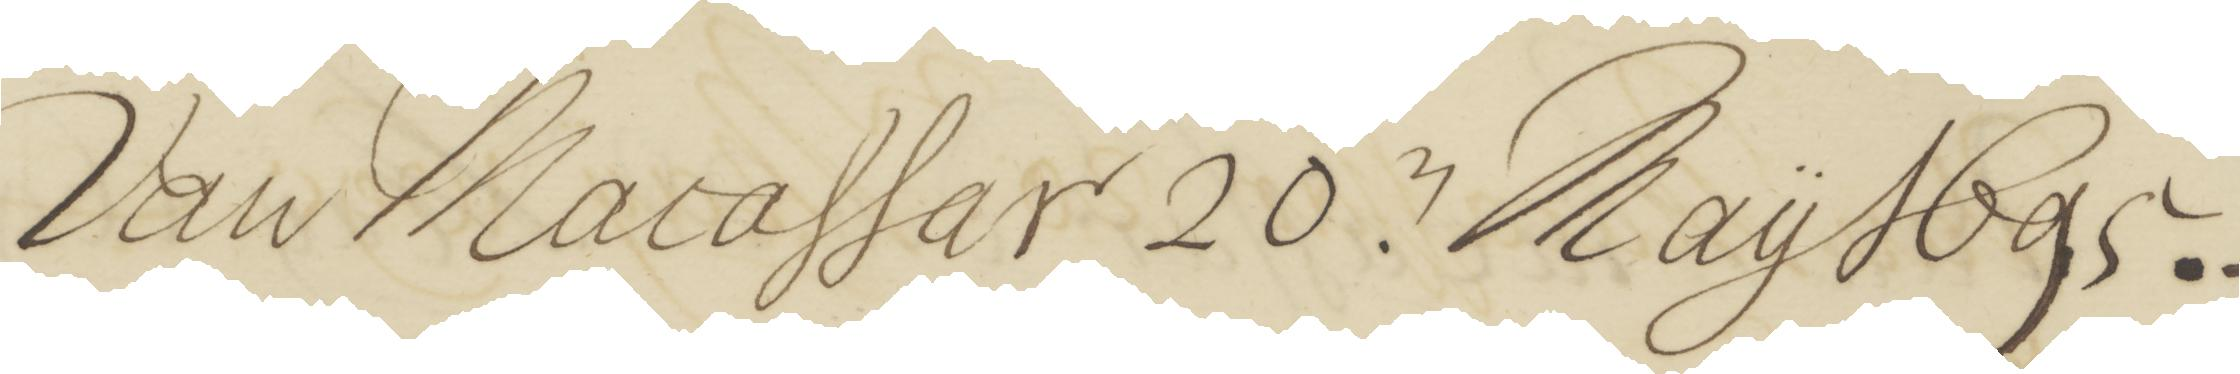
Van Macassar 20:n Maij 1695.
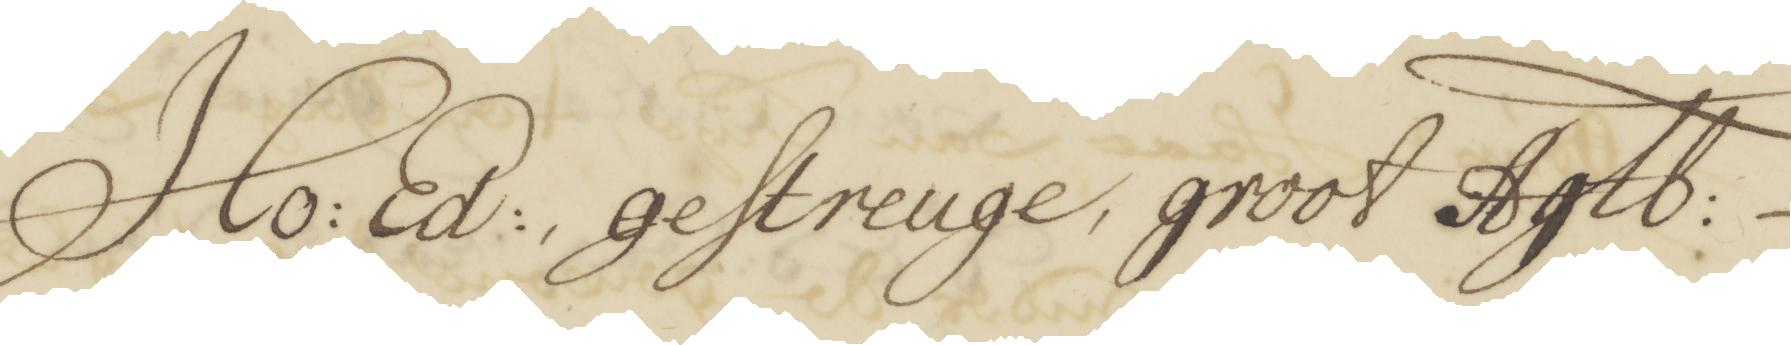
Ho: Ed:, gestrenge, groot Agtb:
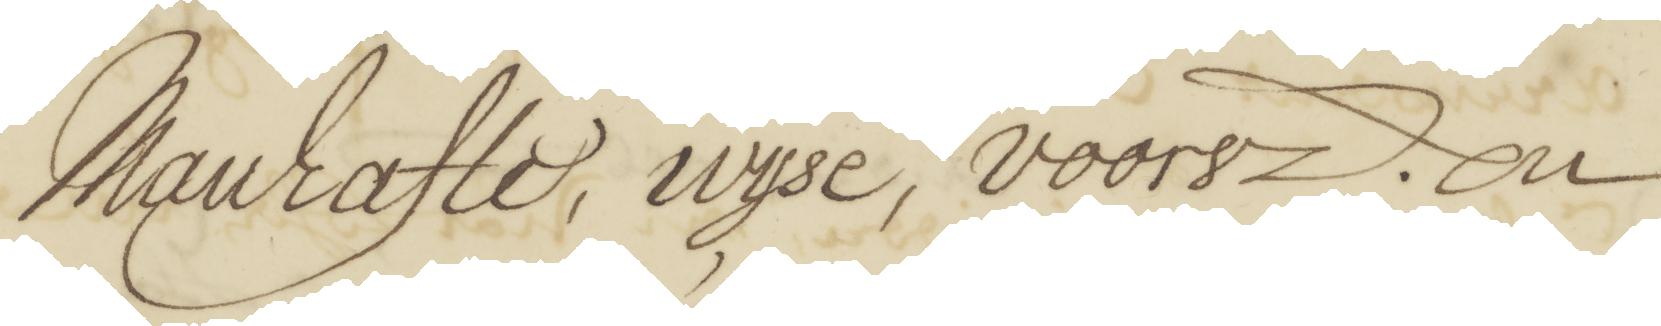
Manhafte, wijse, voorsz. en
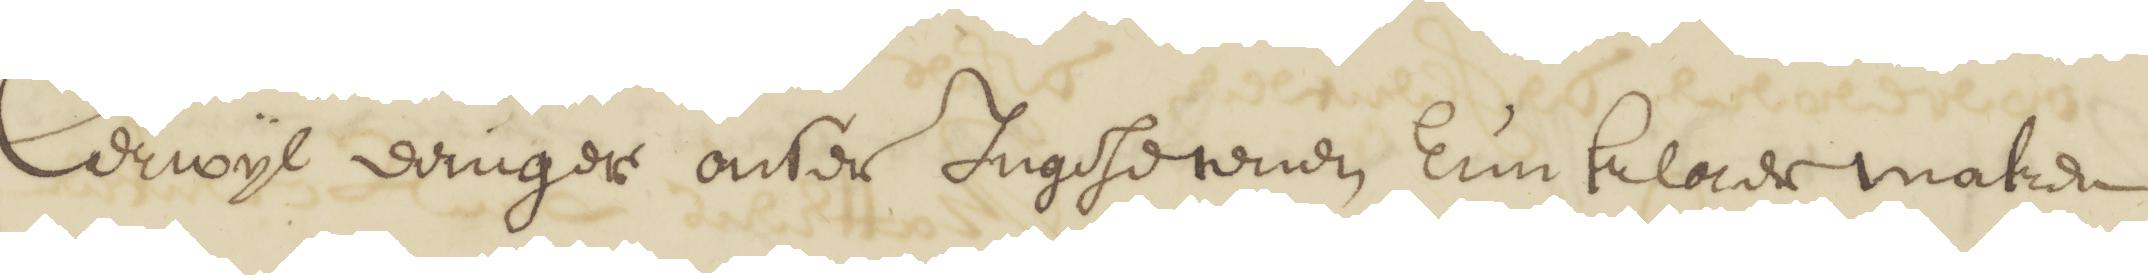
Terwijl eeniger onser Ingesetenen hun klaer maken
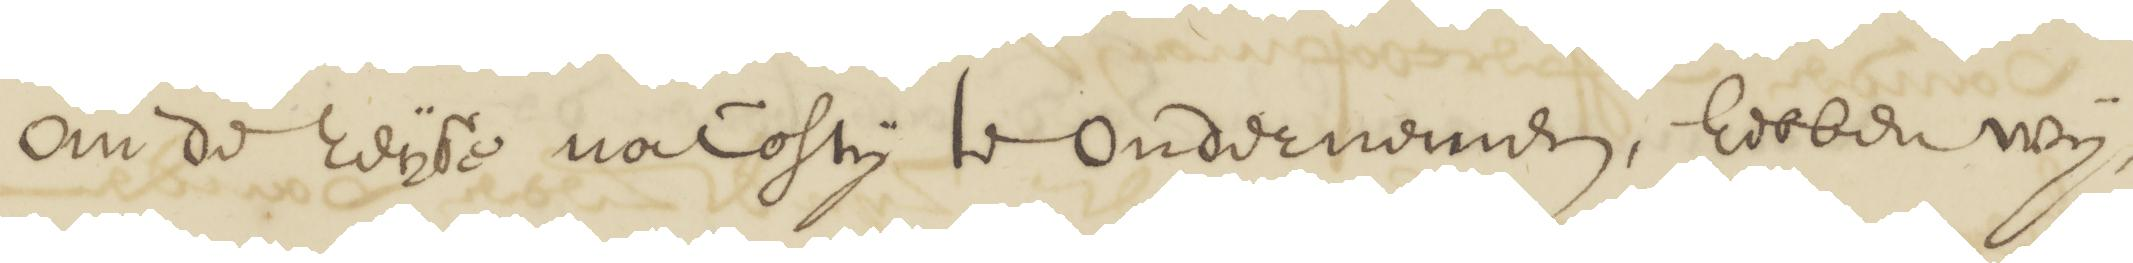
om de reijse na costij te ondernemen, hebben wij
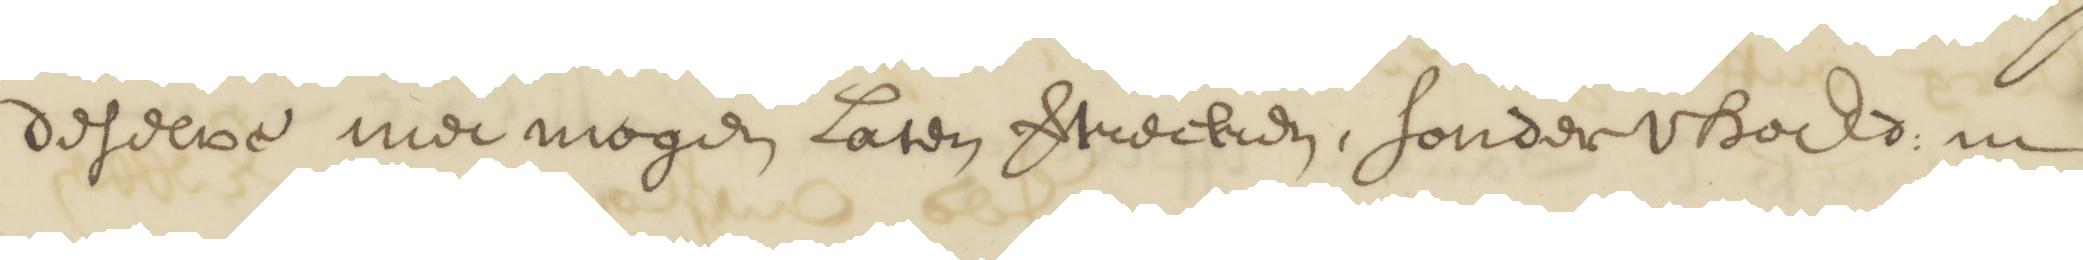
deselve niet mogen laten vertrecken, sonder UHoEd: in
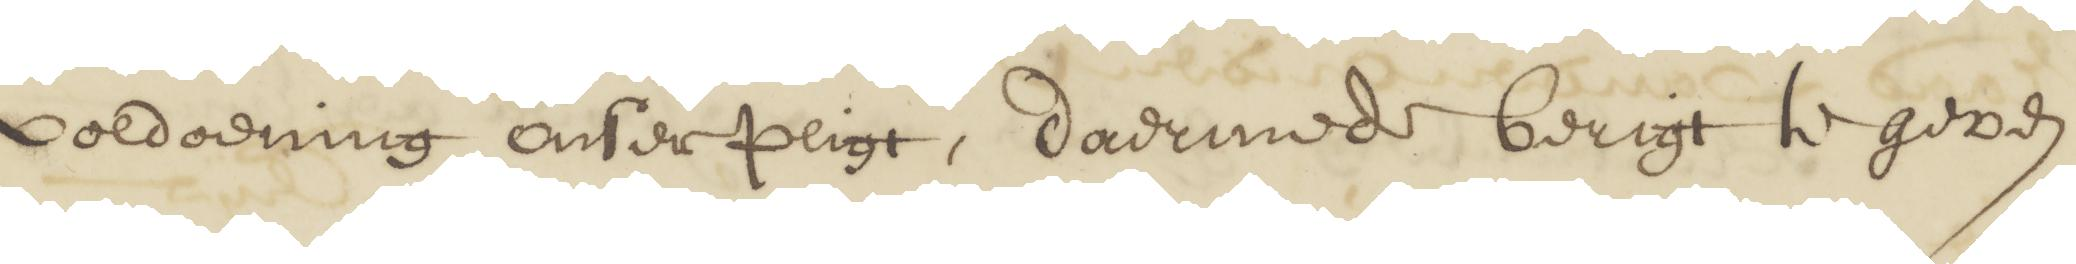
voldoening onser pligt, daermede berigt te geven
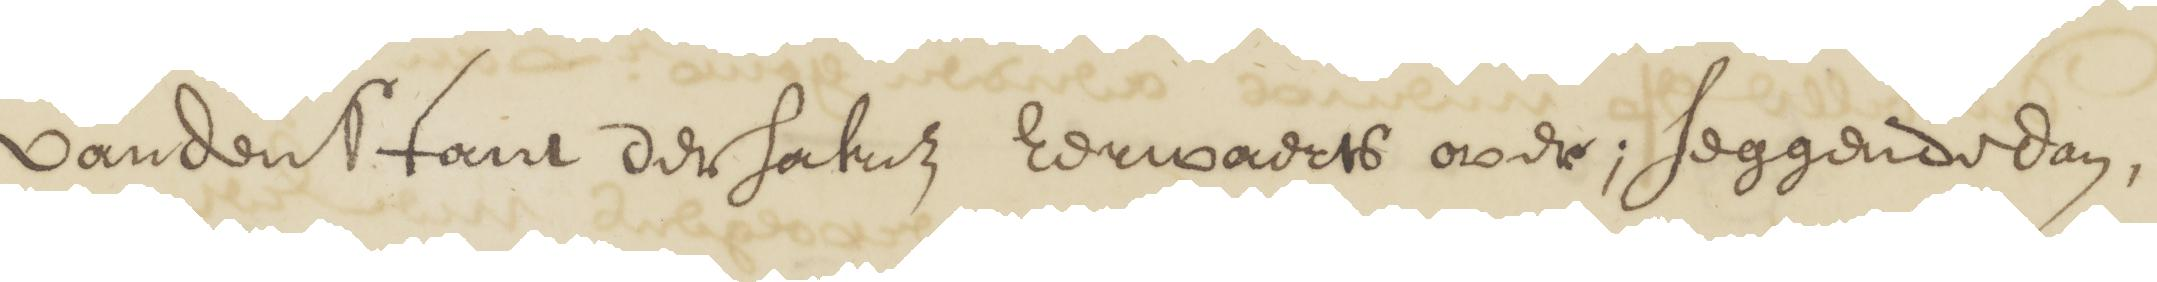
van den stant dersaken herwaerts over; seggende dan,
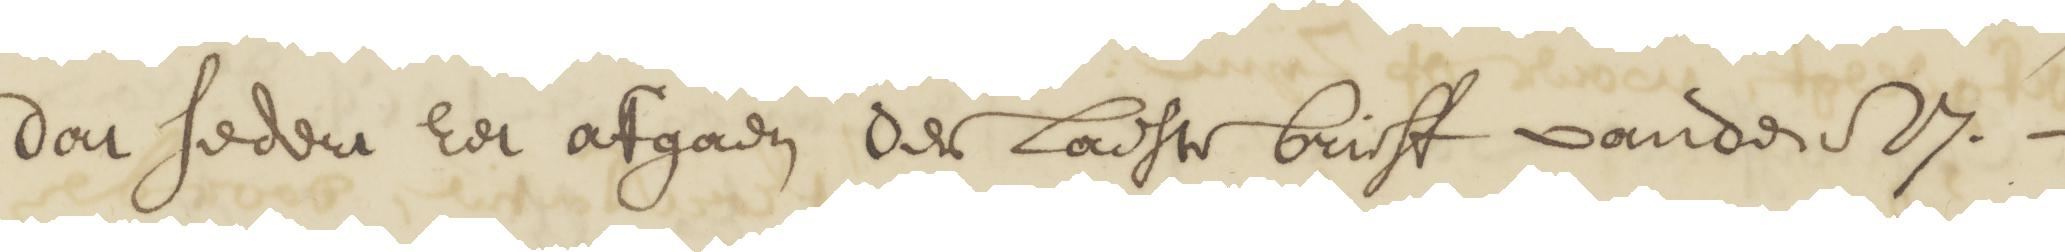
dat sedert het afgaen der laeste brieff van den 27.
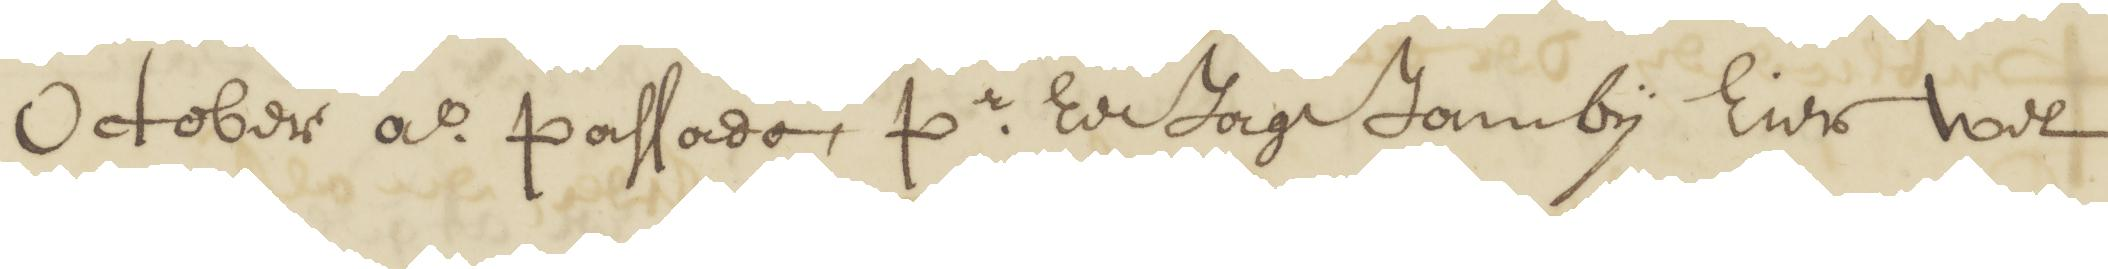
October a.o passado, p.r het Iagt Iambij hier wel
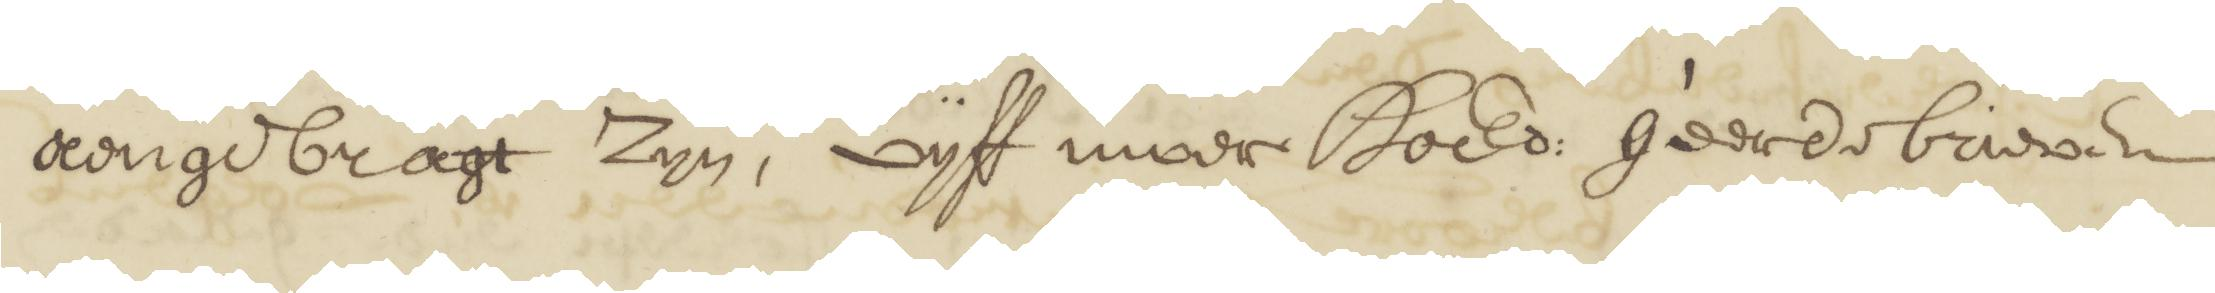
aengebragt zijn, vijff uwer HoEd: g'eerde brieven
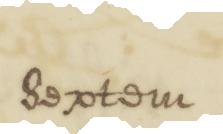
septem
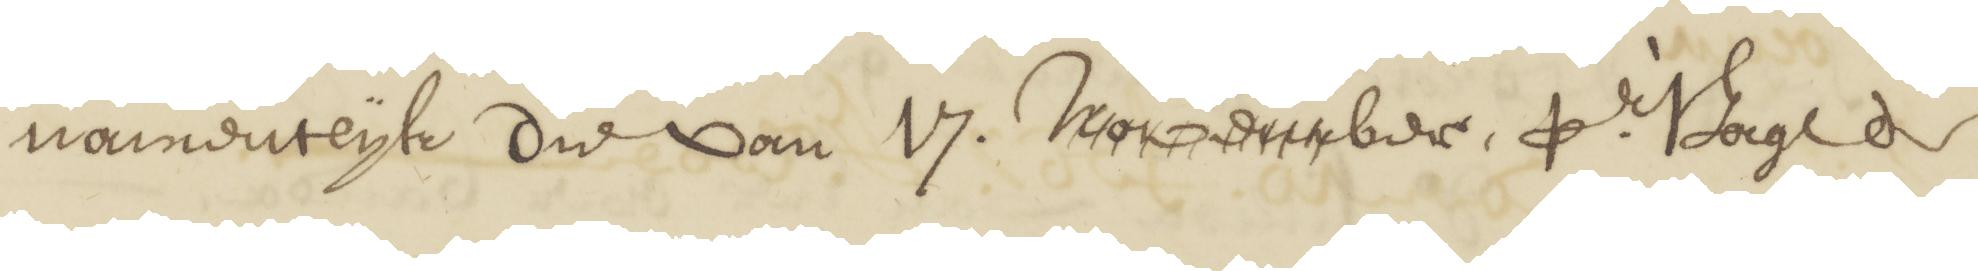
namentlijk die van 17. november, p.r 'tIagt de
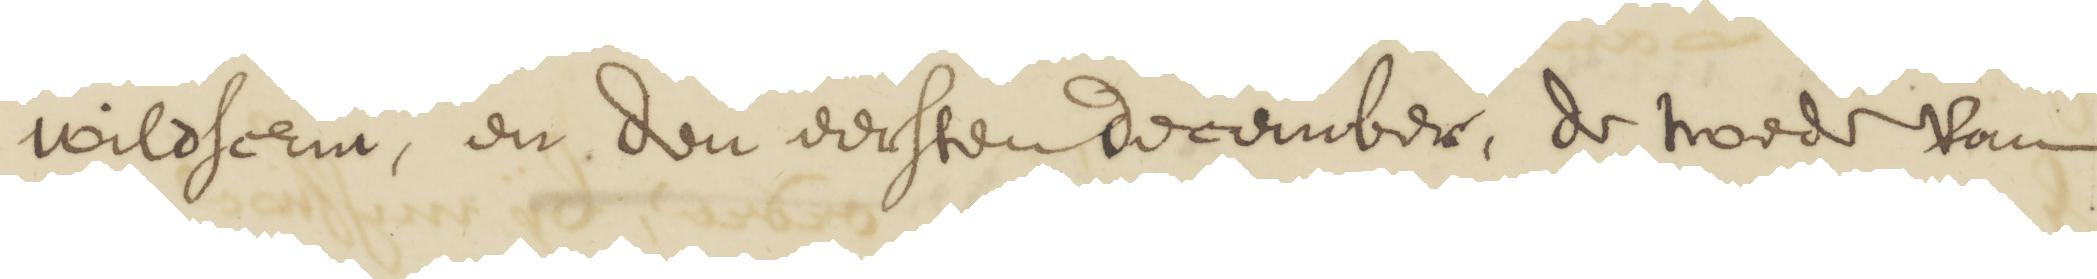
wildschut, en den eersten december, de twede van
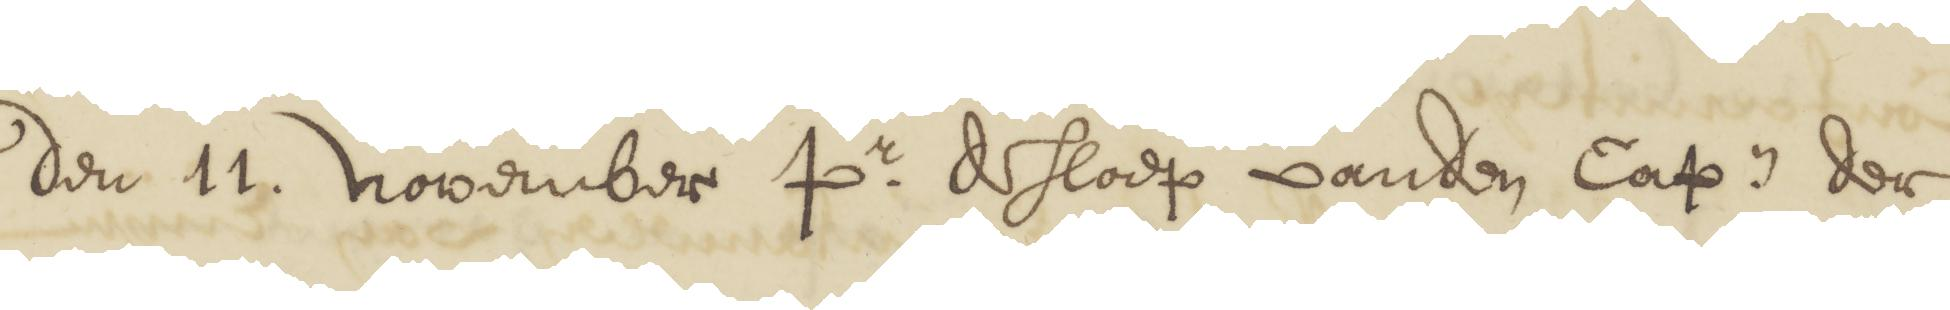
den 11. november p.r desloep vanden Cap.n der
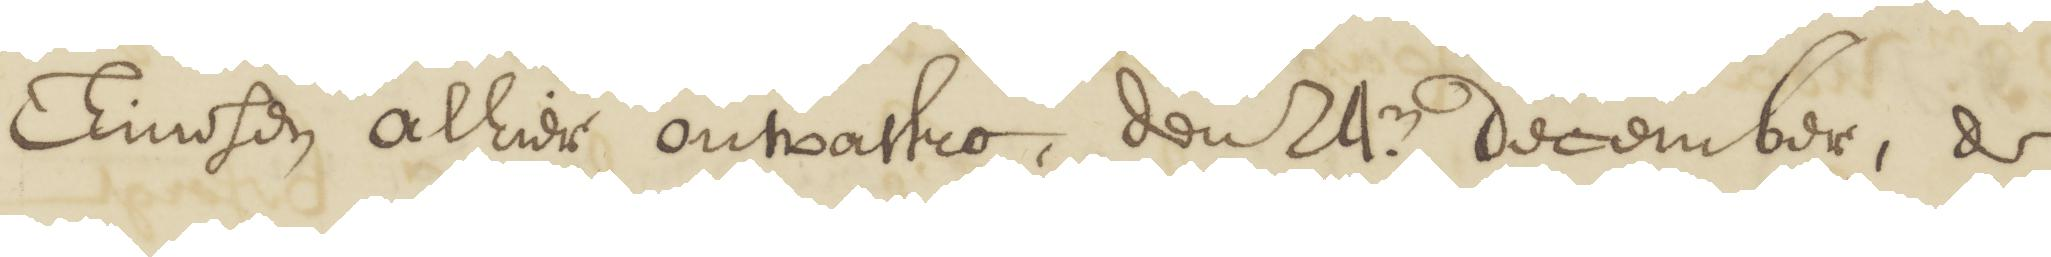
Chinesen alhier onwatko, den 24:n december, de
